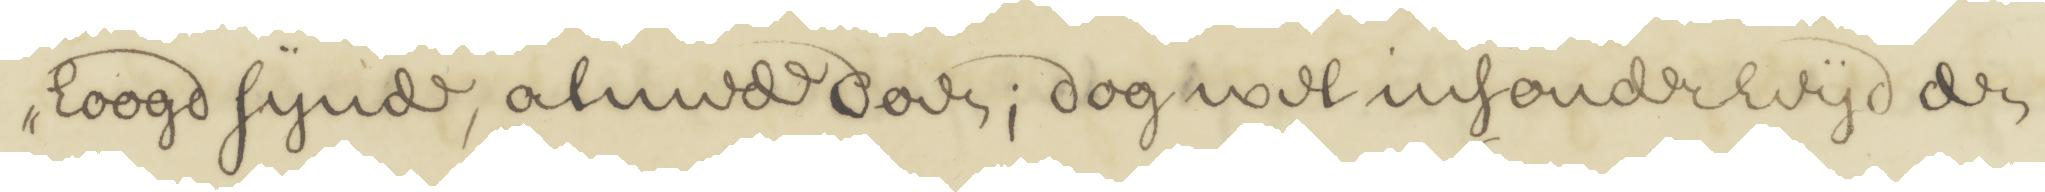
„hoogd sijnde, almede doen; dog wel insonderheijd den
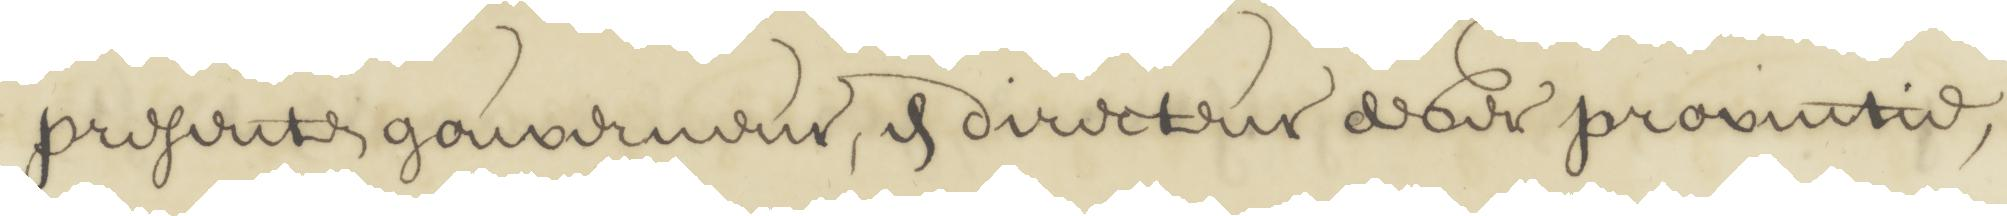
presenten gouverneur, en directeur deser provintie,
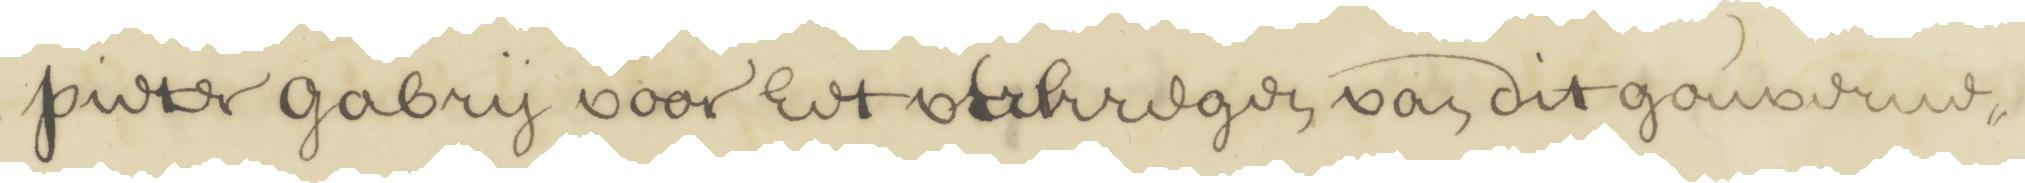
pieter gabrij voor het verkregen van dit gouverne„
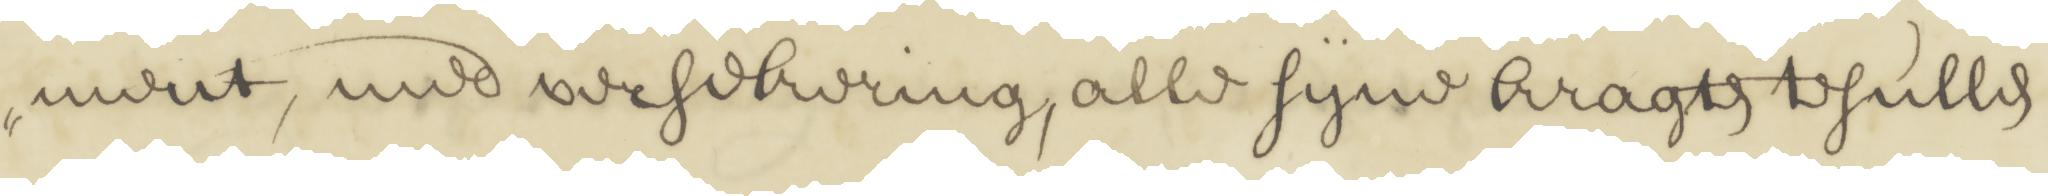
„ment, med versekering, alle sijne kragten te sullen
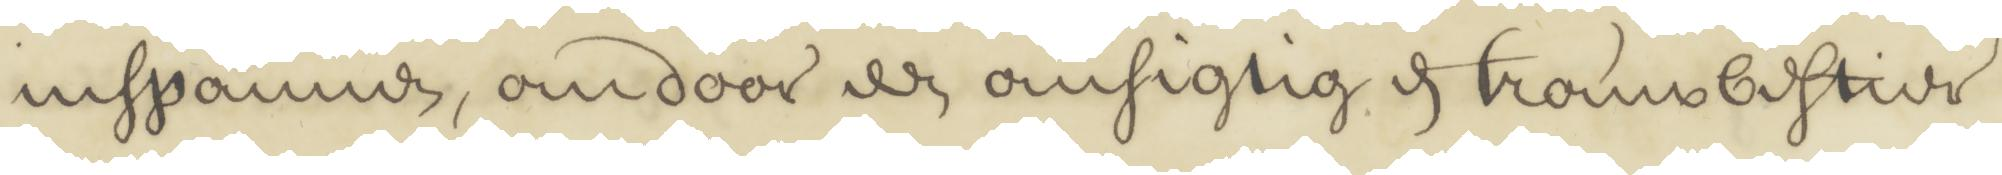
inspannen, om door een omsigtig en trouw bestier
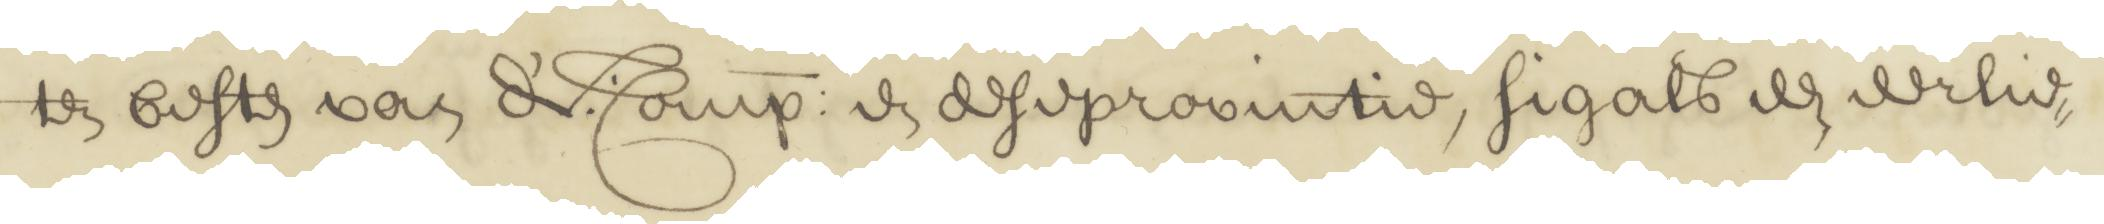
ten besten van d’E:Comp: en dese provintie, sig als een eerlie„
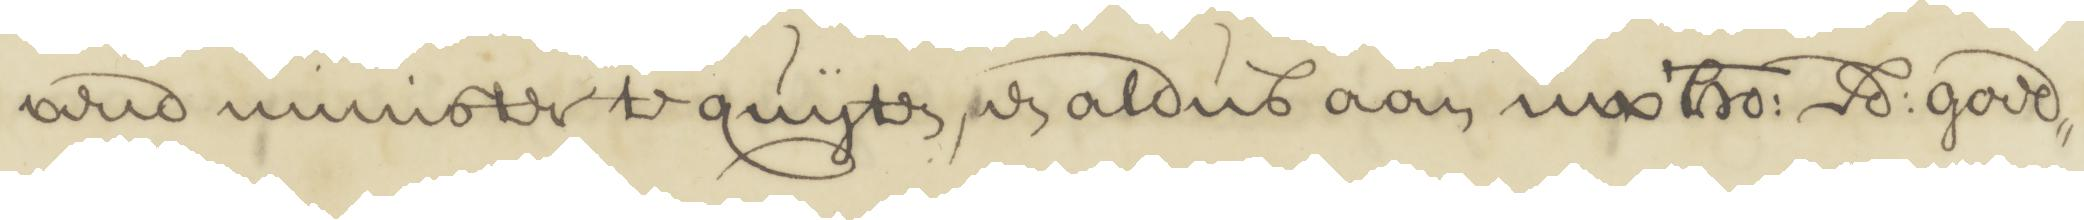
vend minister te quijten, en aldus aan uw Ho: Ed: goed„
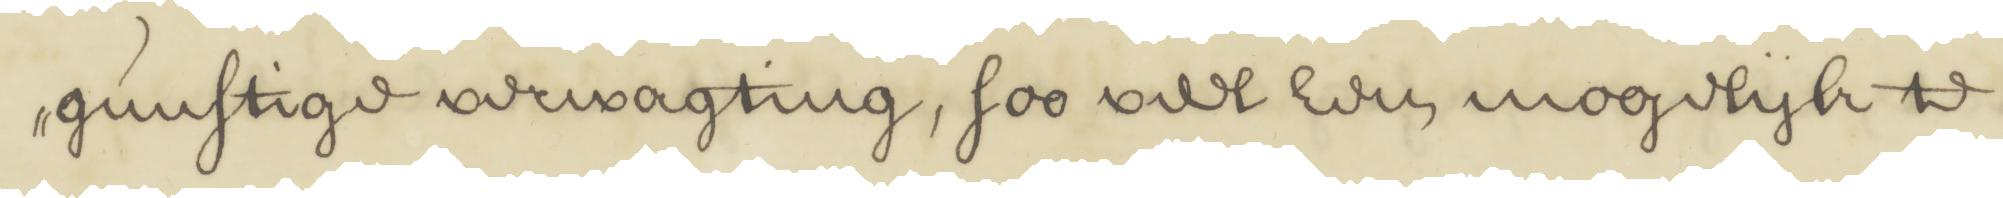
„gunstige verwagting, soo veel hem mogelijk te
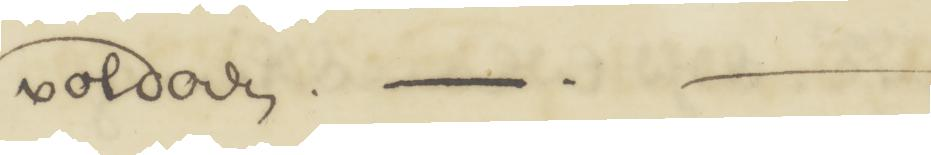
voldoen. —. —
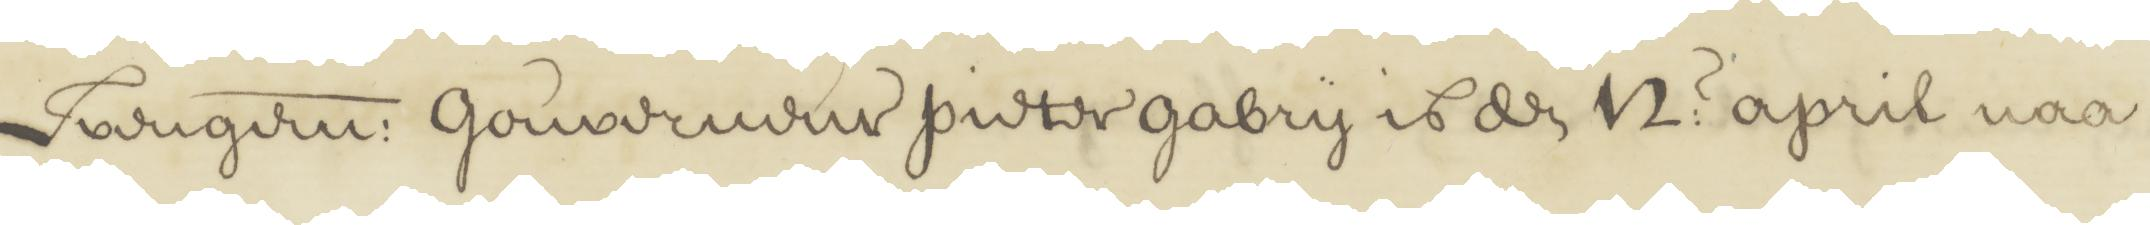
Evengem: gouverneur pieter gabrij is den 12:' april naa
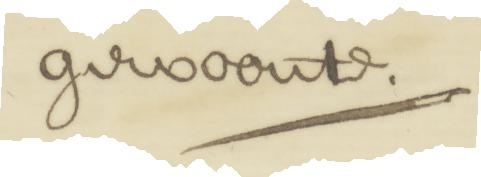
gewoonte.
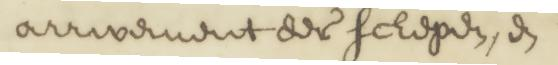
arrivement der schepen, en
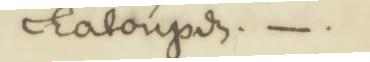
chaloupen. —.
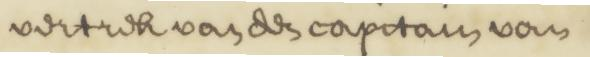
vertrek van den capitain van
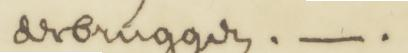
derbruggen. —.
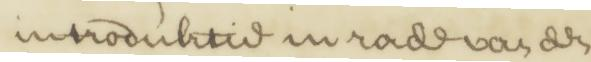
introduktie in rade van den
